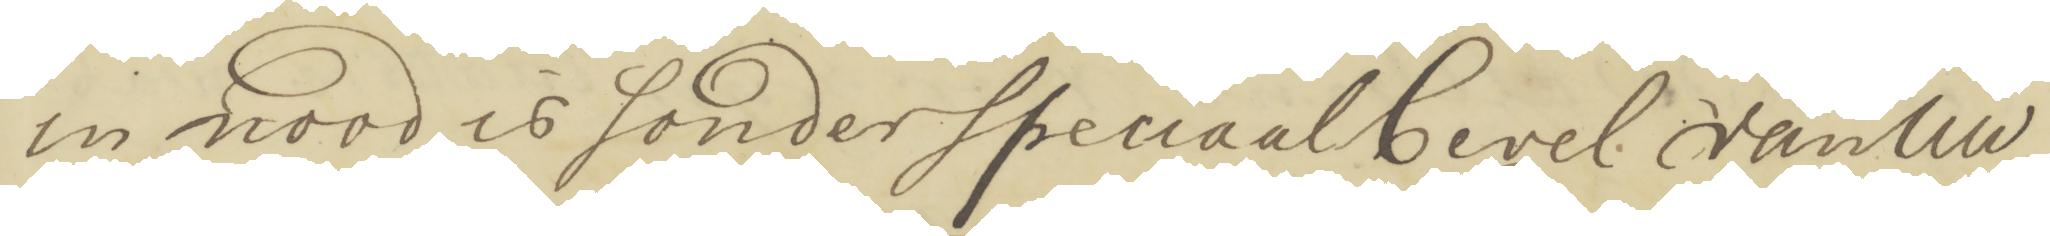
in nood is sonder speciaal bevel van uw
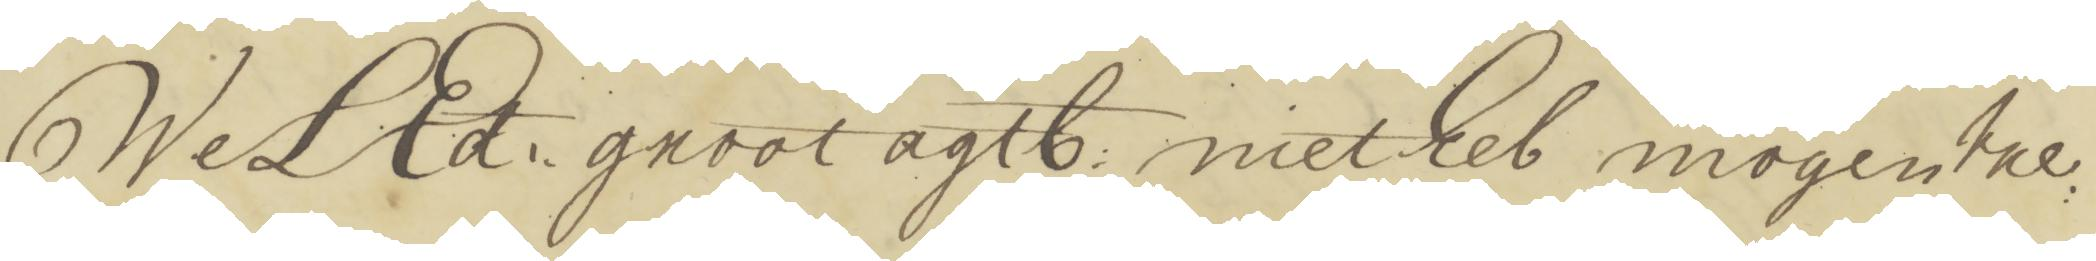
Wel Ed: groot agtb: niet heb mogen tre:
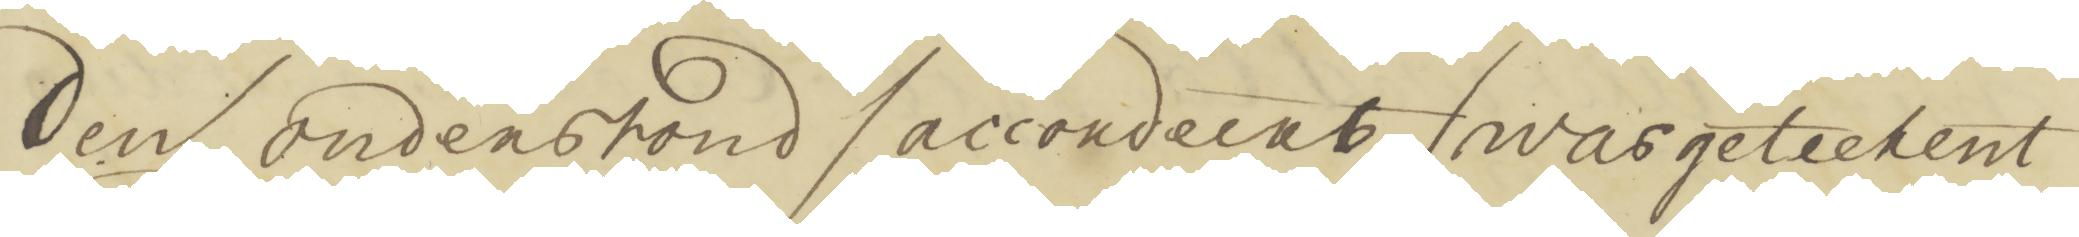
den, onderstond / accordeert / was geteekent
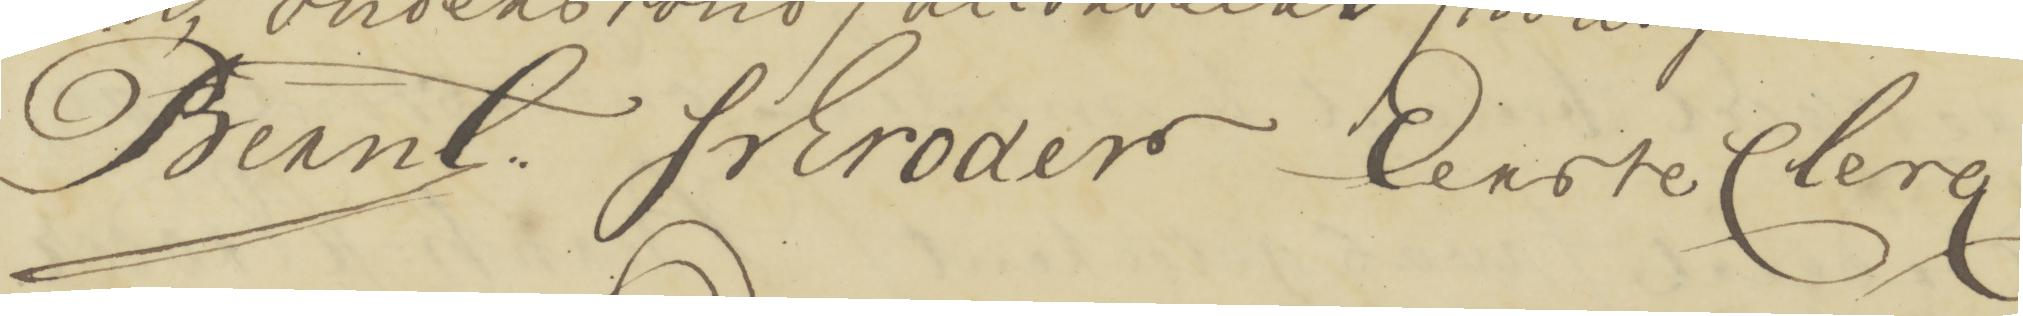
Bernh: schroder Eerste Clerq
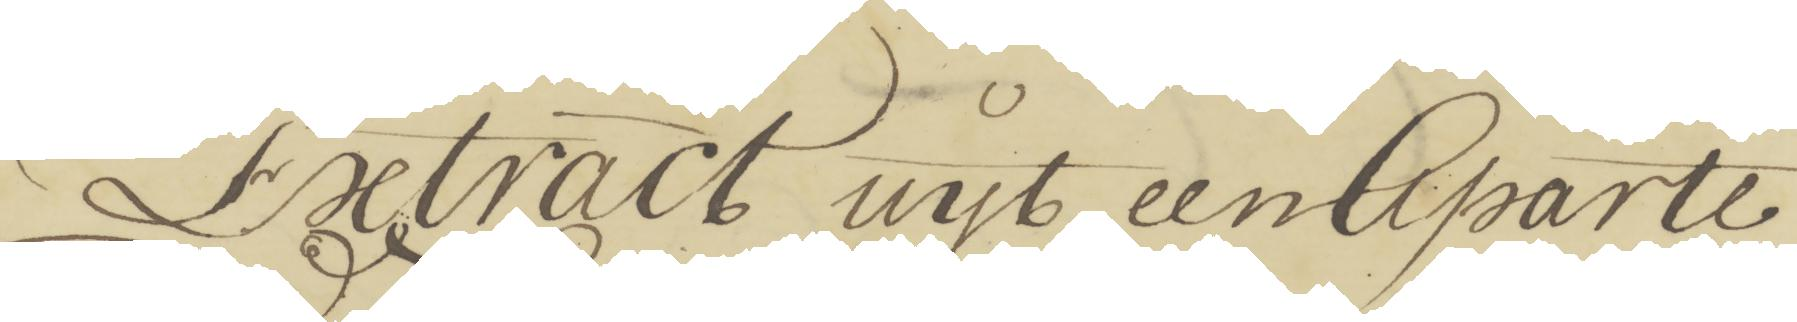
Extract uijt een Aparte
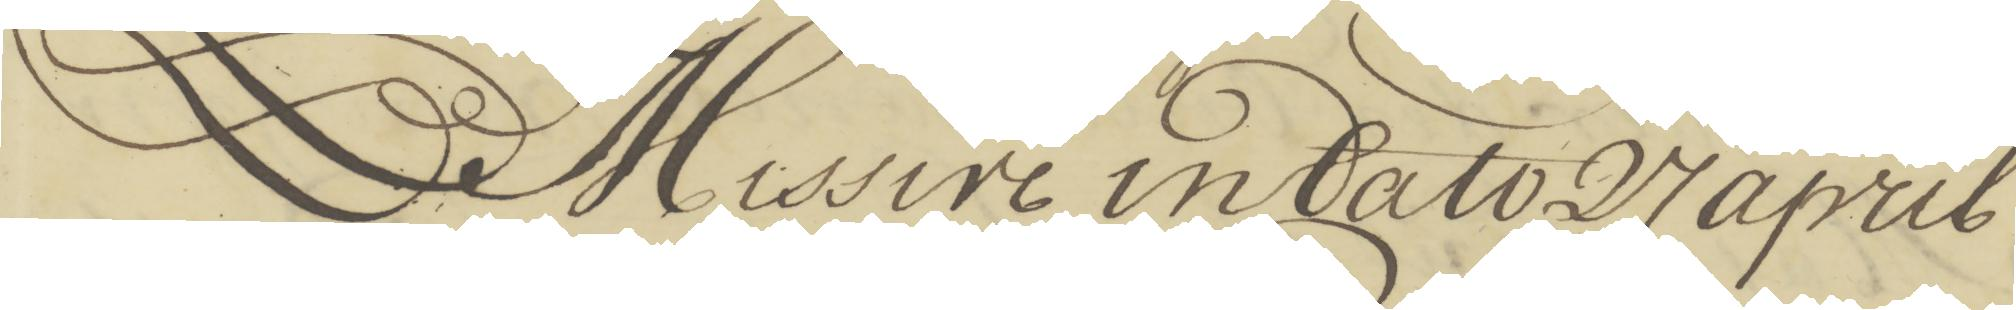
Missive in dato 27 april
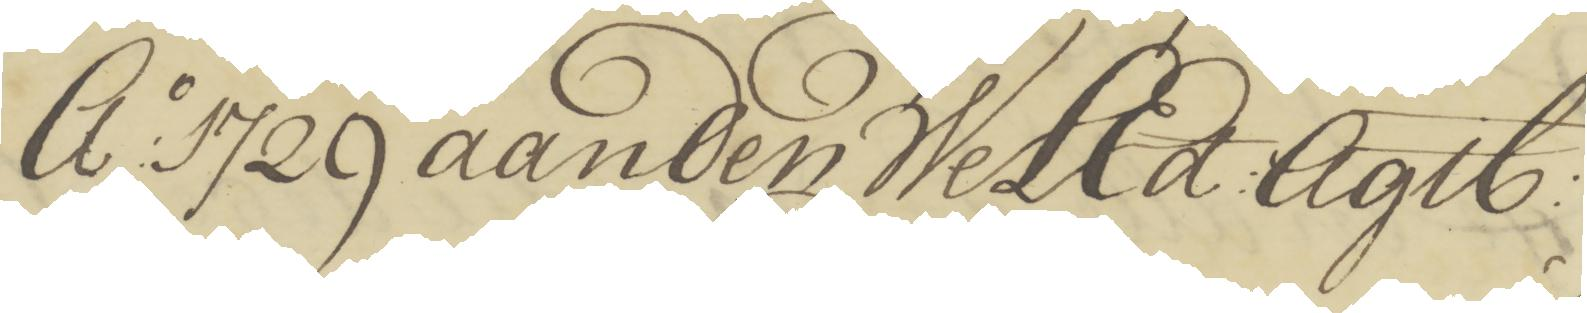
A:o 1729 aan den WelEd: Agtb:
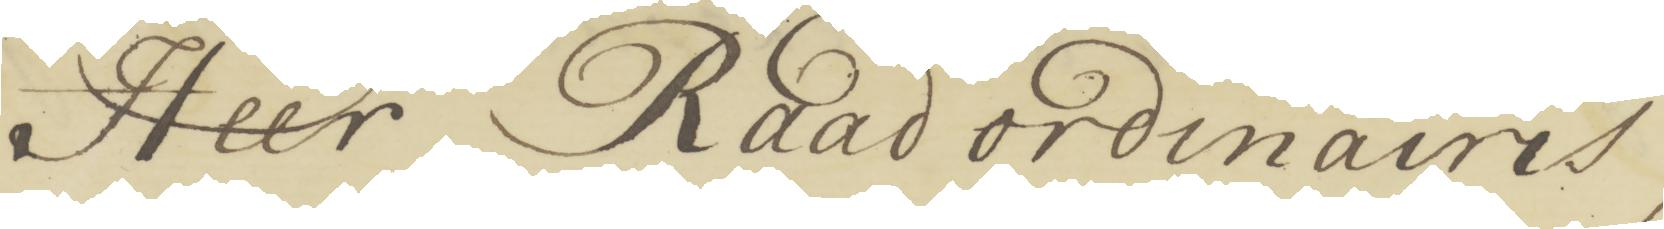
Heer Raad ordinairis
